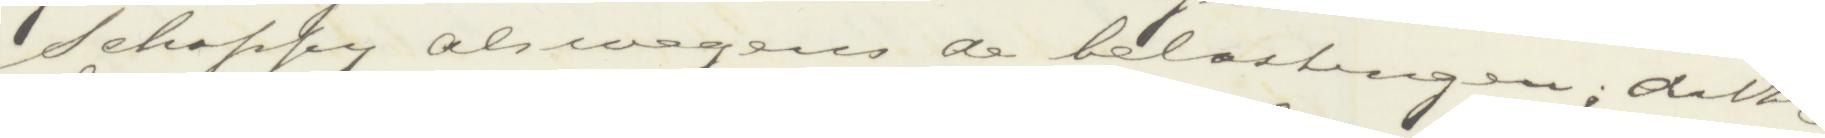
schappy als wegens de belastingen; datzy
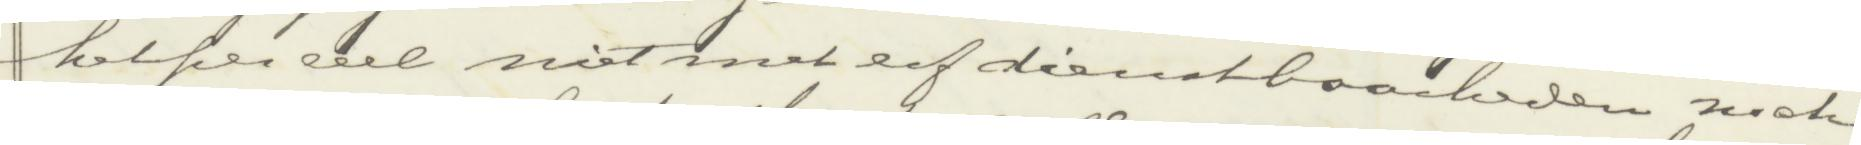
het perceel niet met erfdienstbaarleden noch
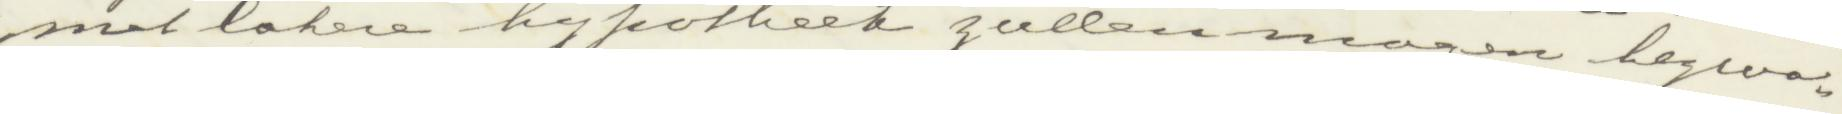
met latere hypotheek zullen mogen bezwa„
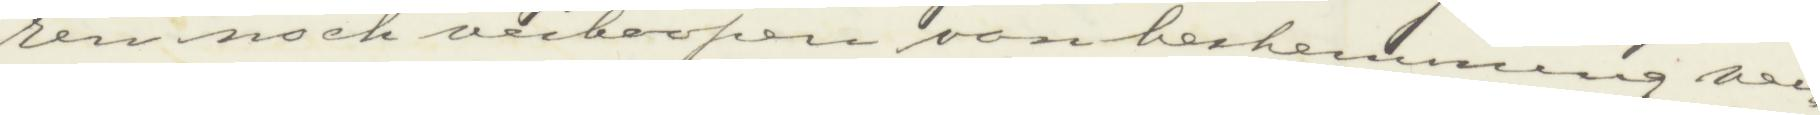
ren noch verkoopen van bestemming ver
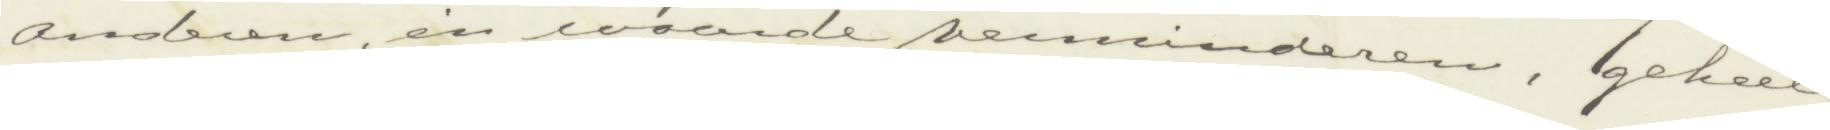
anderen, in waarde verminderen, geheel
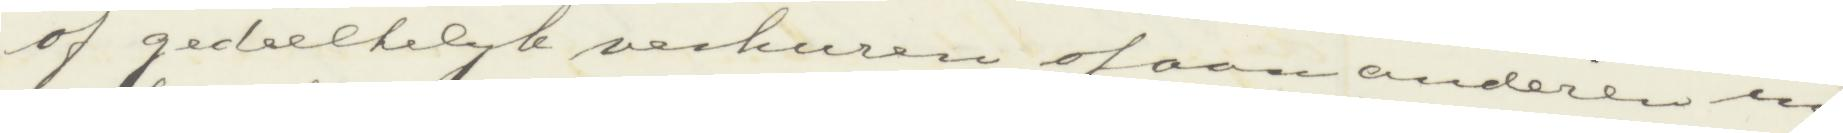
of gedeeltelyk verhuren of aan anderen in
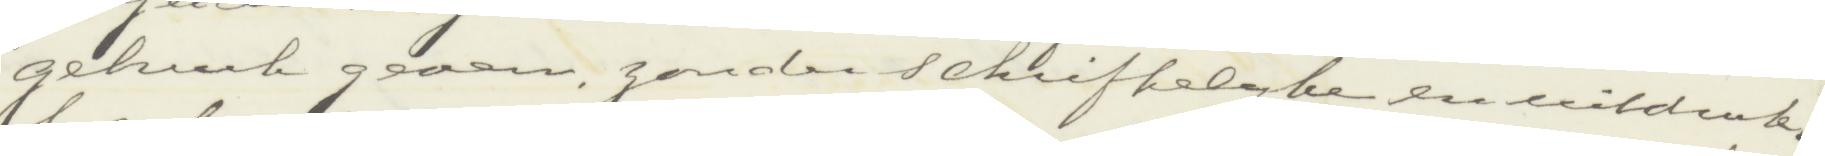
gebruik geven, zonder schriftelyke en uitdruk„
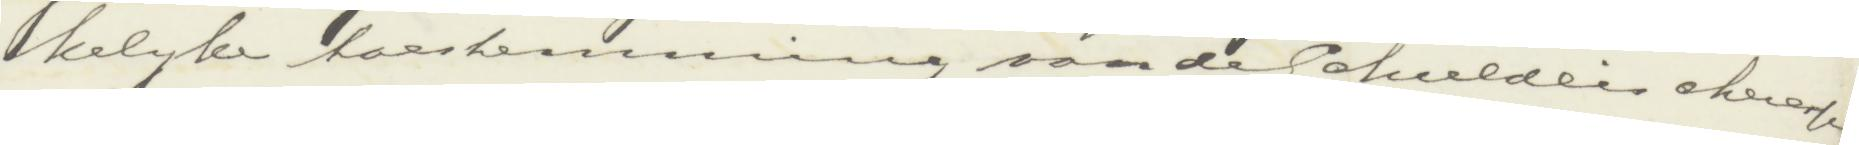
kelyke toestemming van de Schuldeischeresse
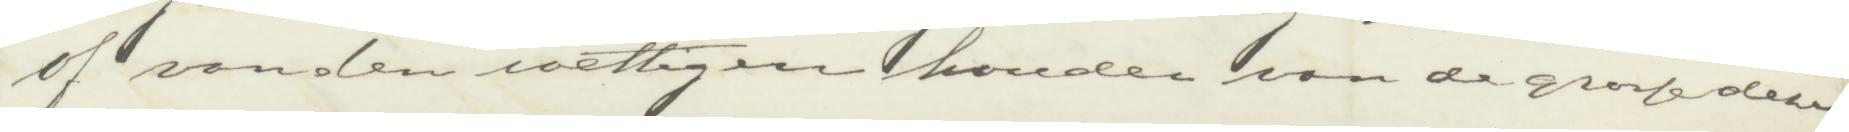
of van den wettigen houden van de grosse dezer
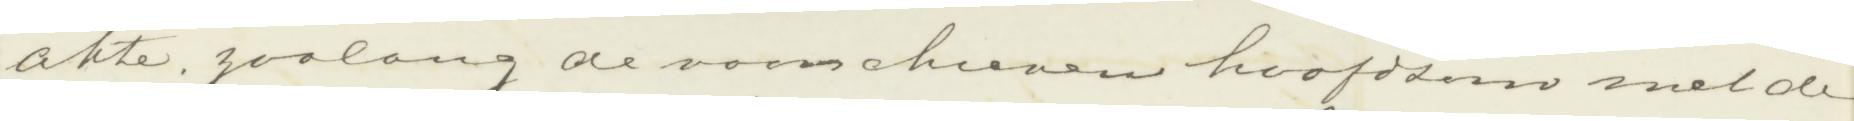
akte, zoolang de voorschreven hoofdsom met de
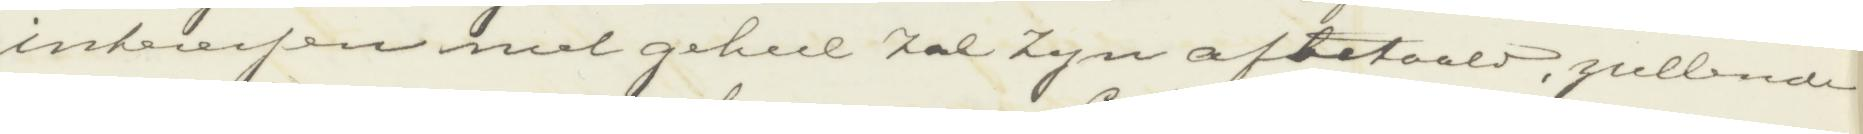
interessen niet geheel zal zyn afbetaald, zullende
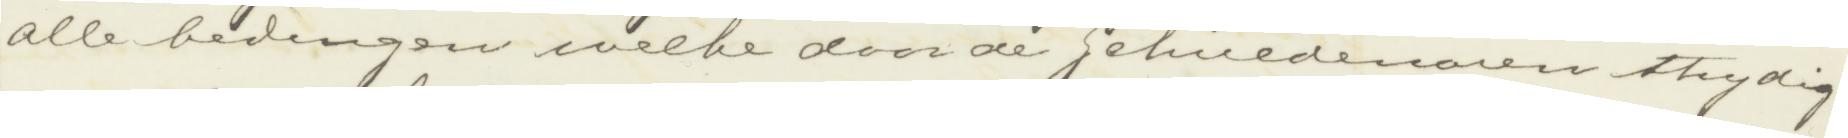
alle bedingen welke door de schuldenaren strydig
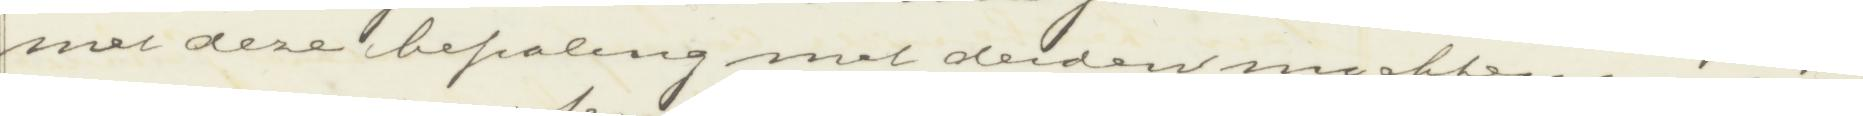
met deze bepaling met derden mochten worden
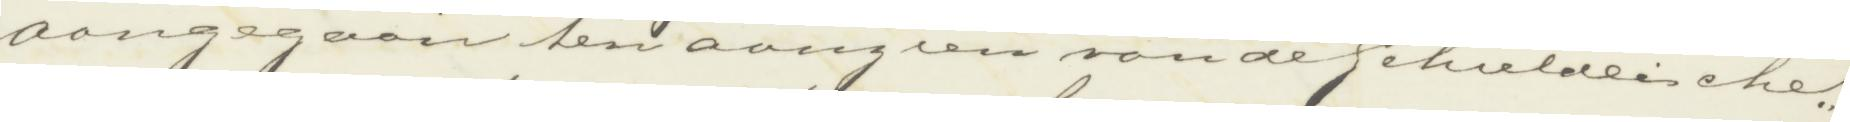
aangegaan ten aanzien van de Schuldeische„
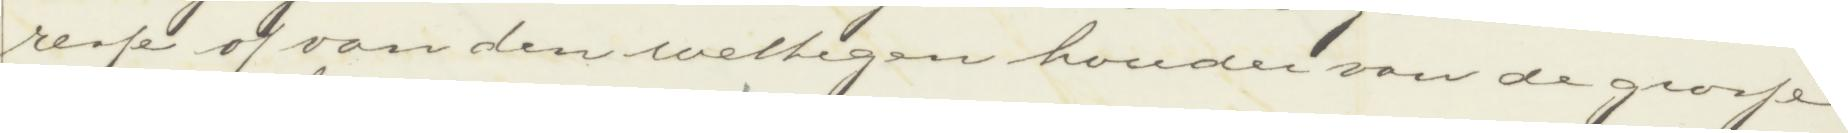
resse of van den wettigen houder van de grosse
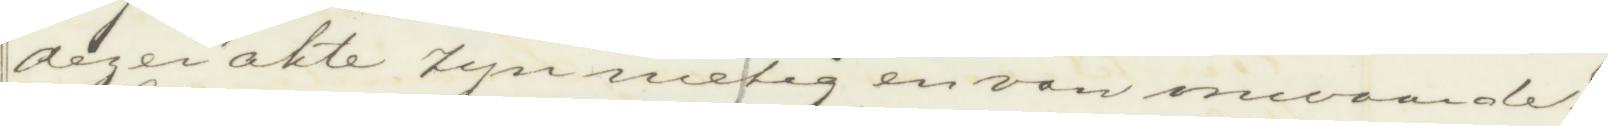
dezer akte zyn nie|tig en van onwaarde.
